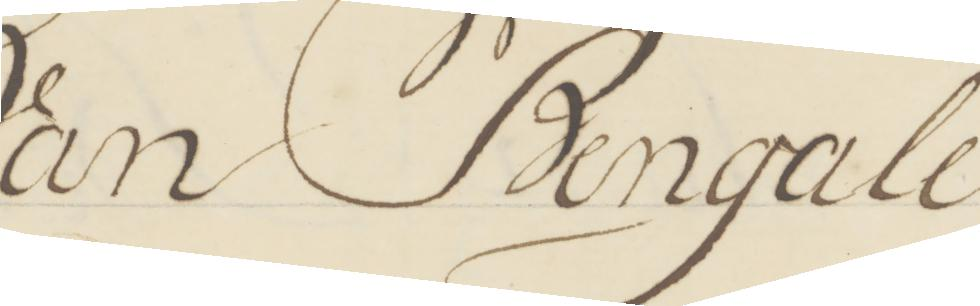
Van Bengale
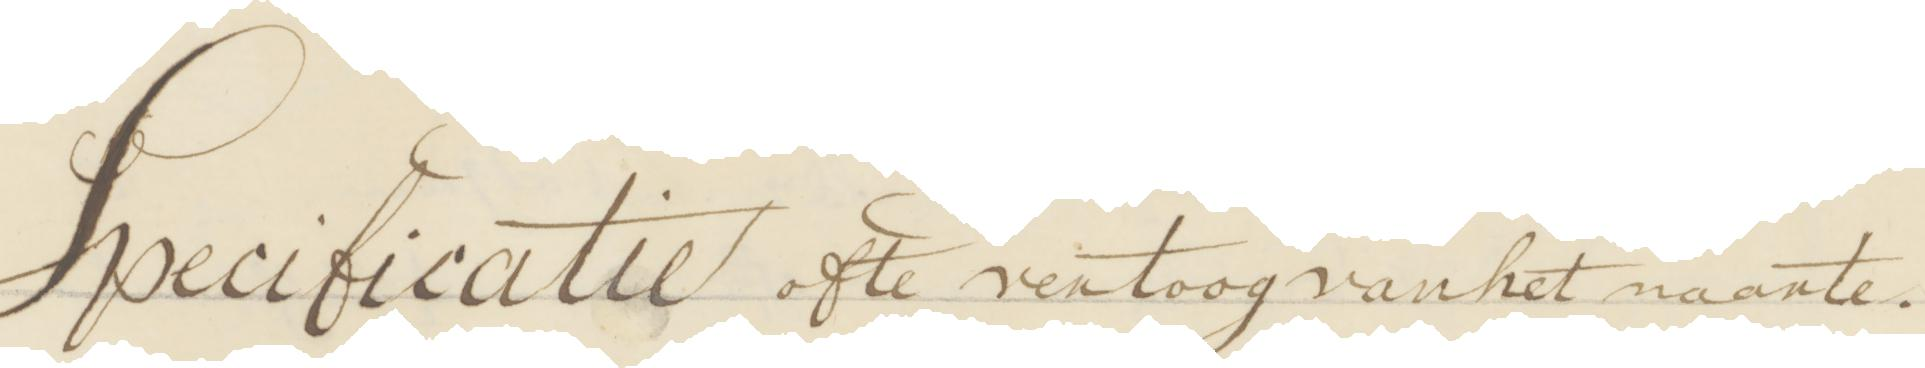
Specificatie ofte vertoog van het naar te„
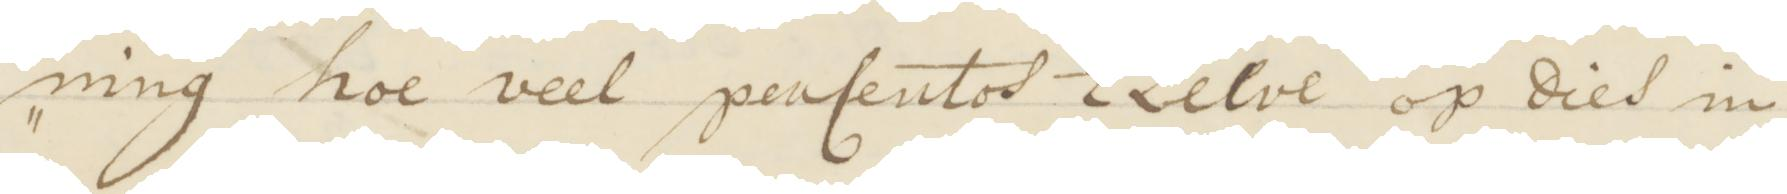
„ning hoe veel percentos 't zelve op dies in
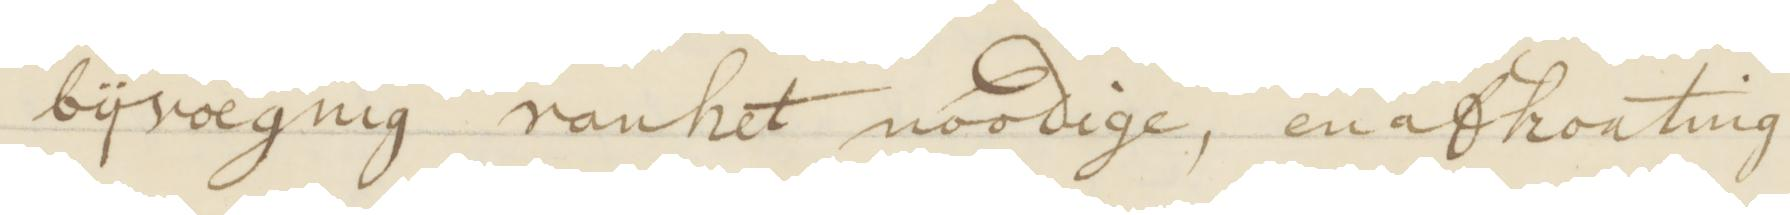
bijvoeging van het noodige, en afkorting
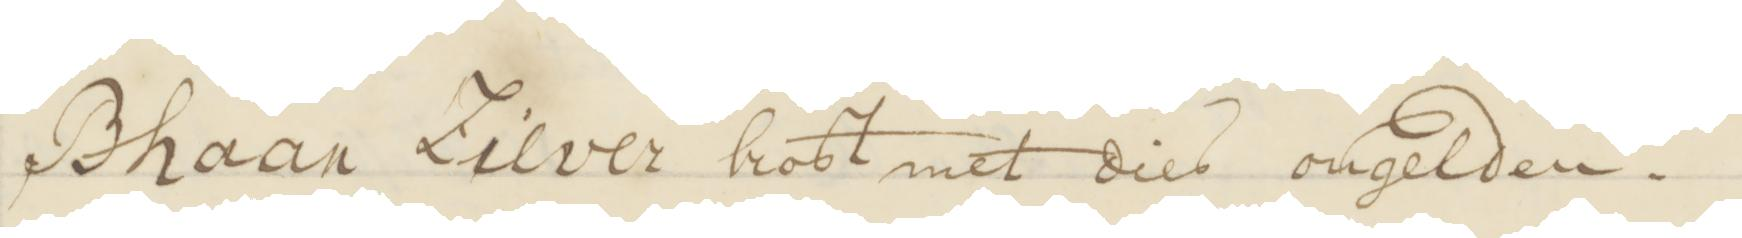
Bhaar zilver kost met dier ongelden .
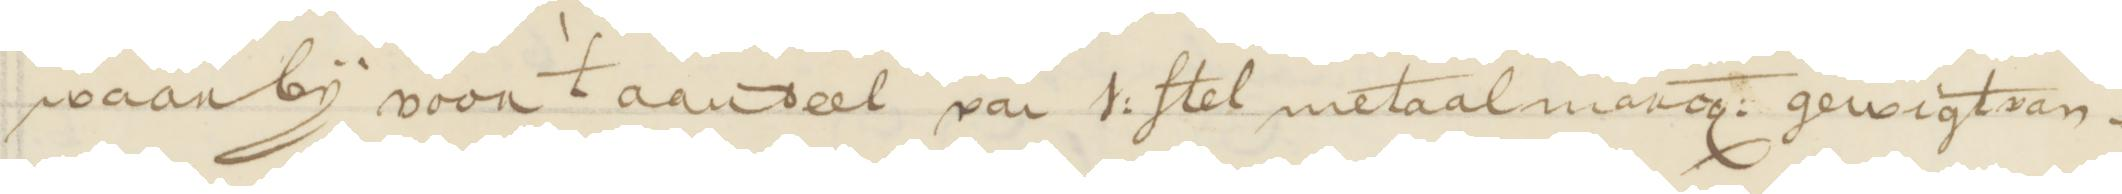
waar bij voor 't aandeel van 1: stel metaal marcq: gewigt van .
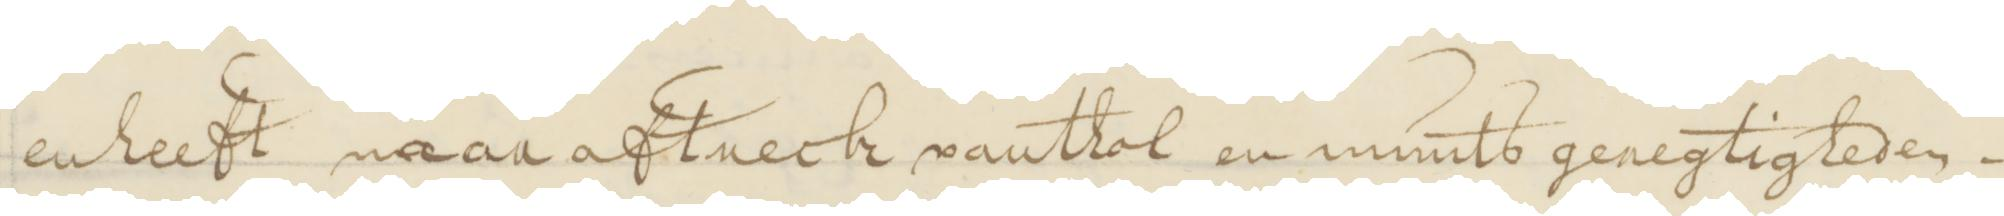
en heeft naar aftreck van thol en munts geregtigheden
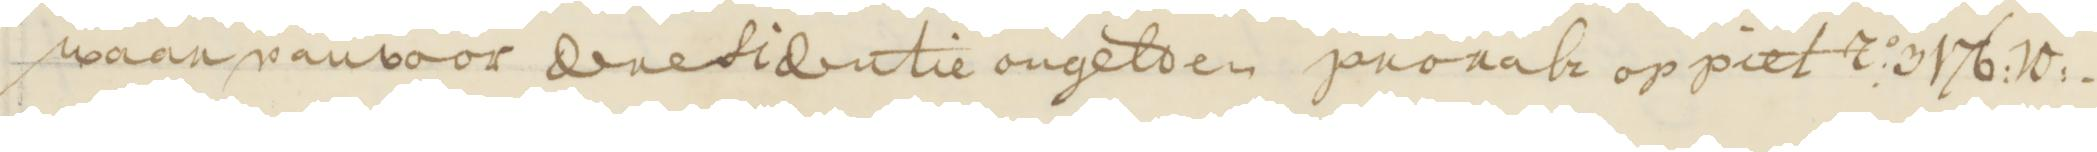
waarvan voor de residentie ongelden prorak op piet r:o 3176: 10:
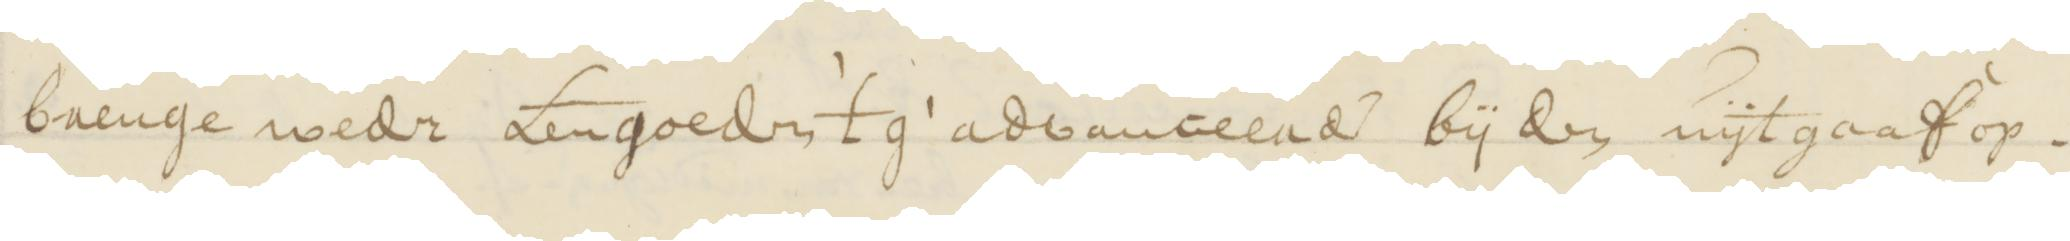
brenge weder ten goeden ’t g’advanceerd bij den uijtgaaf op
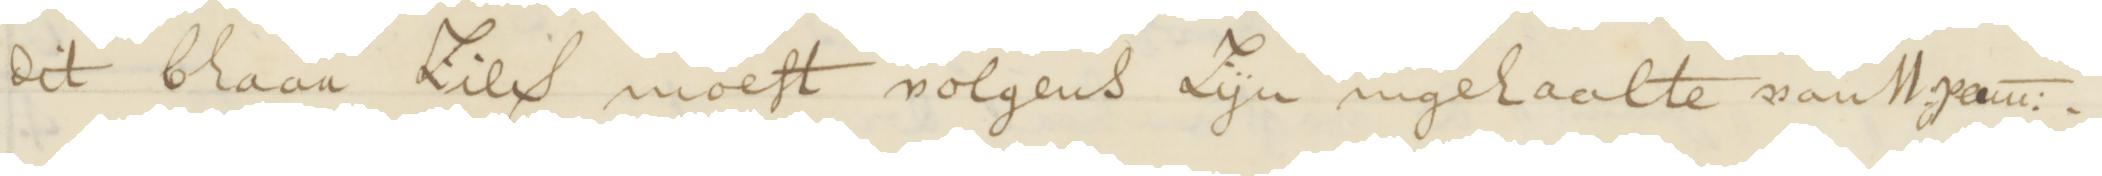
dit bhaar zilver moest volgens zijn ingehaalte van 11. penn: -
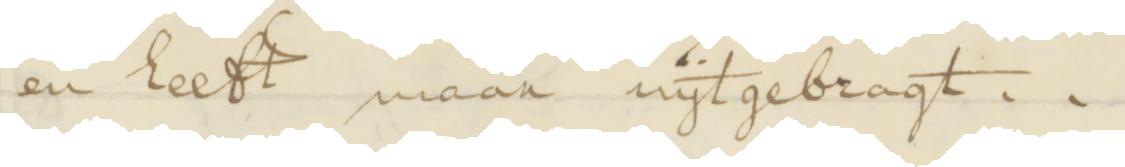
en heeft maar uijt gebragt
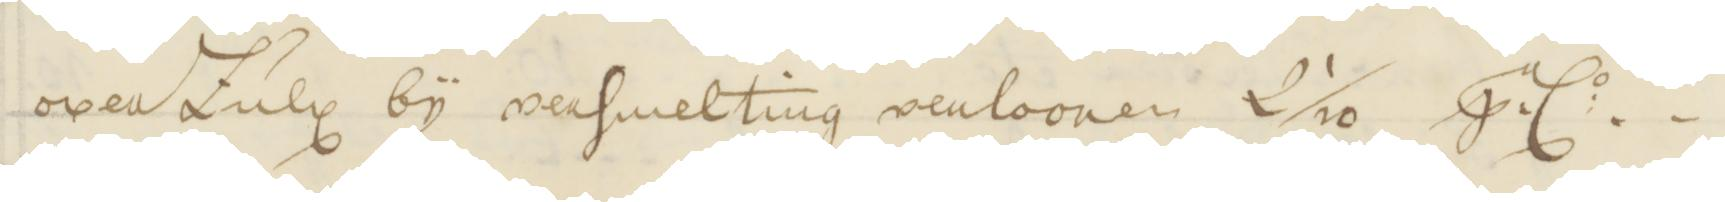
over zulx bij versmelting verlooren 2 1/10 p„r C:o
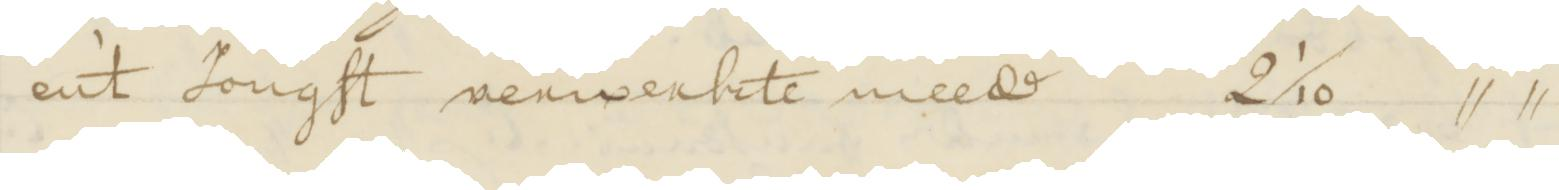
en't Jongst verwerkte meede 2 1/10 „ „
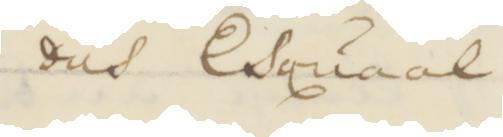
dus Esquaal
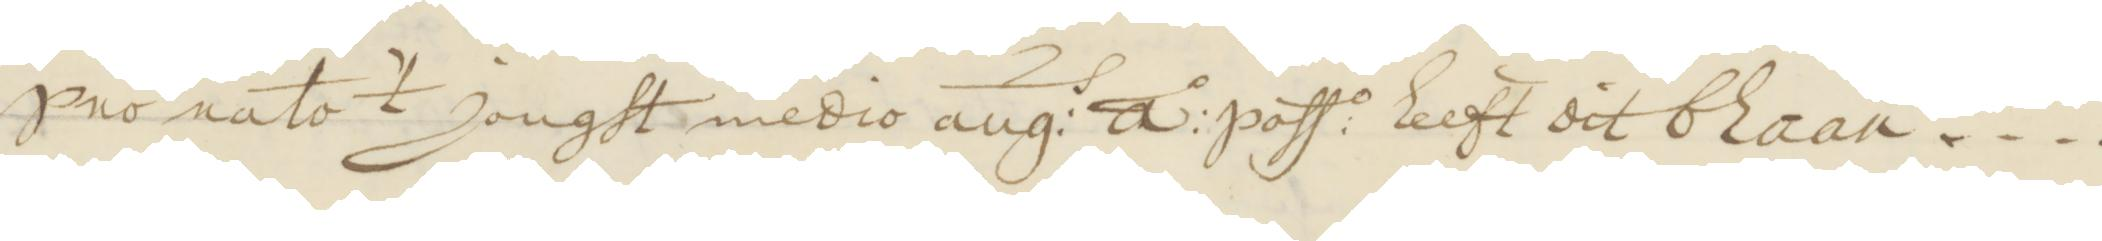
pro rato 't jongst medio aug:s a:o poss:o heeft dit bhaar
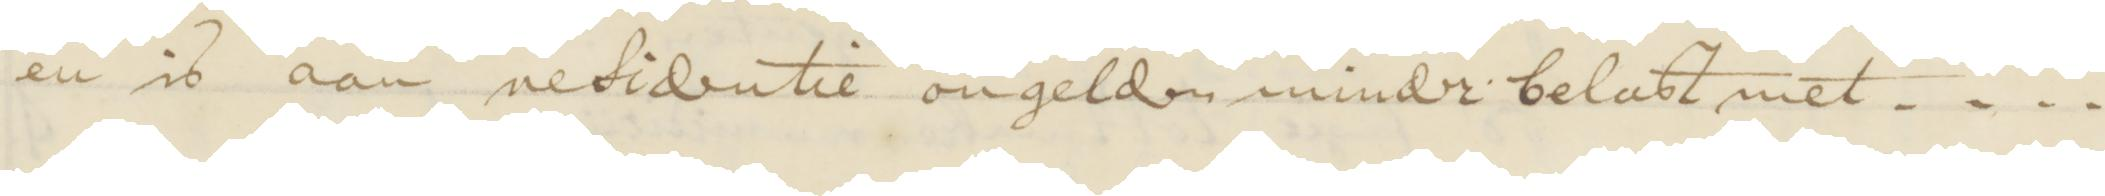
en is aan residentie ongelden minder belast met
